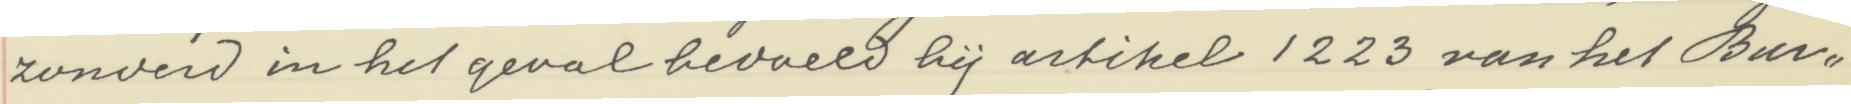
zonderd in het geval bedoeld bij artikel 1223 van het Bur„
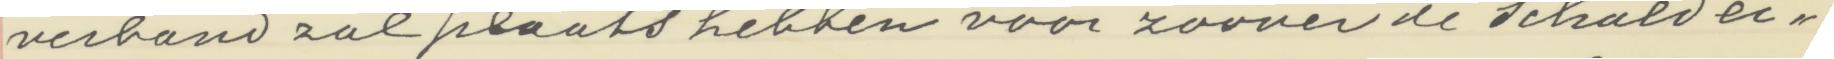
verband zal plaats hebben voor zoover de schuld ei„
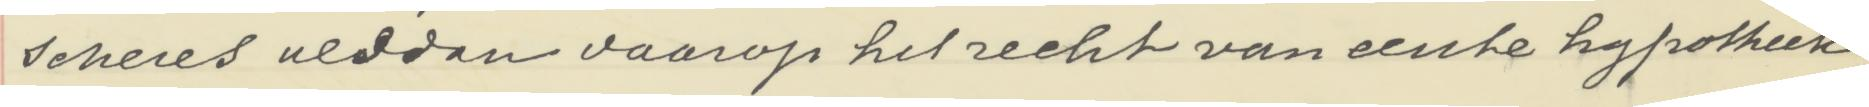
scheres alsdan daarop het recht van eerste hypotheek
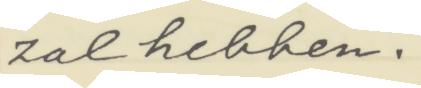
zal hebben.
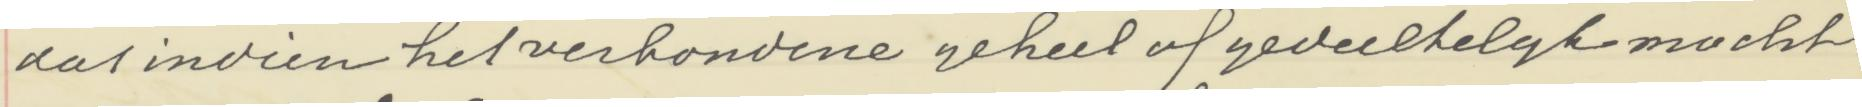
dat indien het verbondene geheel of gedeeltelyk mocht
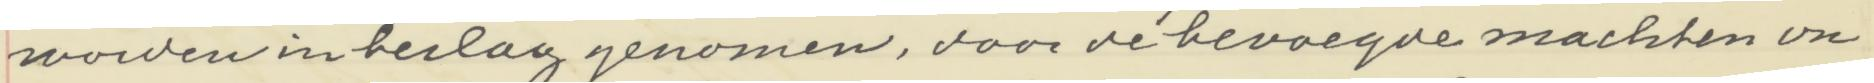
worden in beslag genomen, door de bevoegde machten on
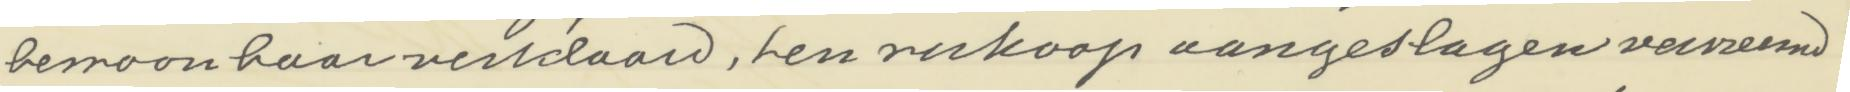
bewoonbaar verklaard, ten verkoop aangeslagen vervreemd
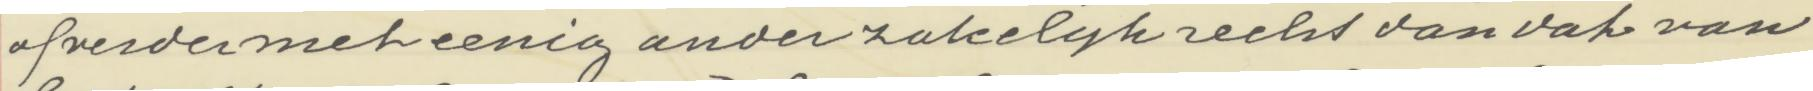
of verder met eenig ander zakelyk recht van dat van
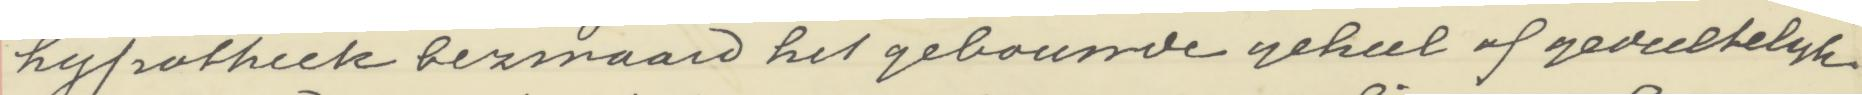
hypotheek bezwaard het gebouwde geheel of gedeeltelyk
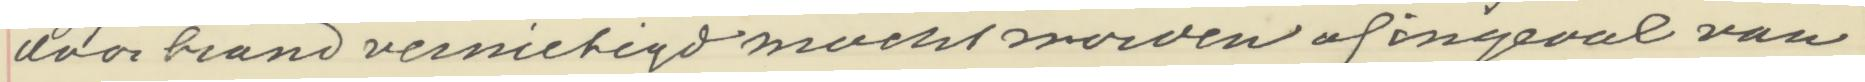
door brand vernietigd mocht worden of ingeval van
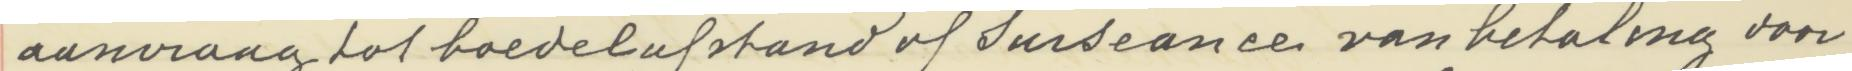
aanvraag tot boedelafstand of surseance van betaling door
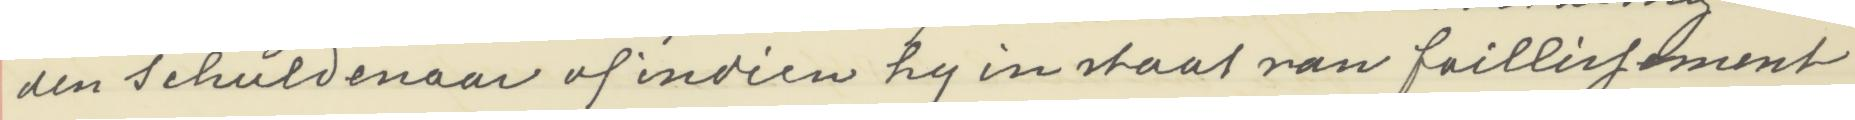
den schuldenaar of indien hy in staat van faillissement
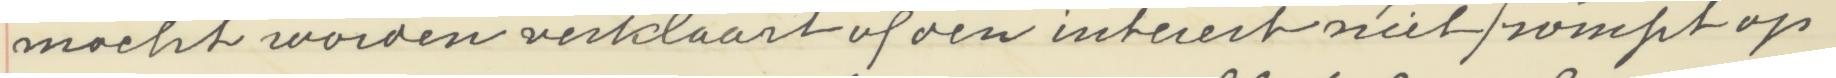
mocht worden verklaart of den interest niet prompt op
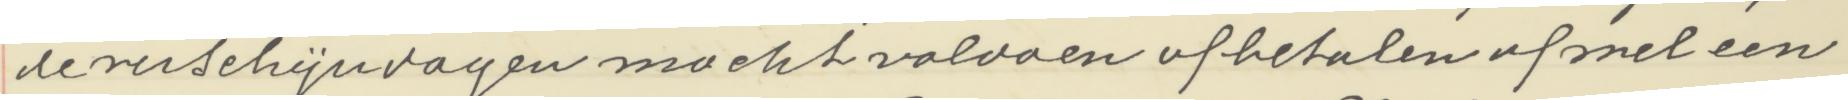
de verschijndagen mocht voldoen of betalen of wel een
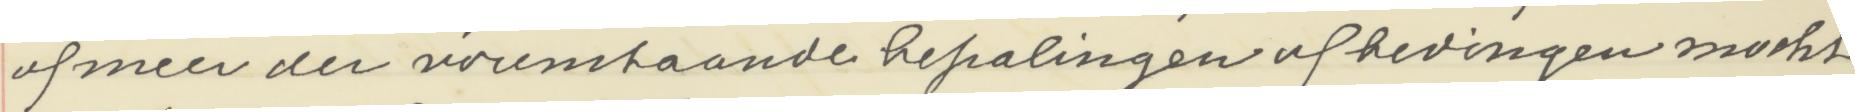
of meer der vorenstaande bepalingen of bedingen mocht
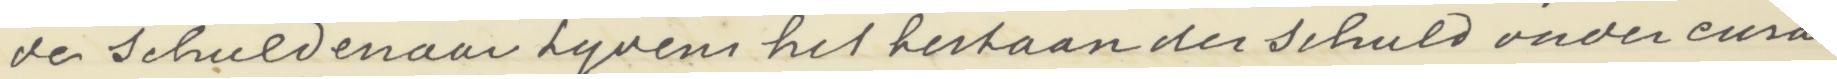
de schuldenaar tydens het bestaan den schuld onder cura
